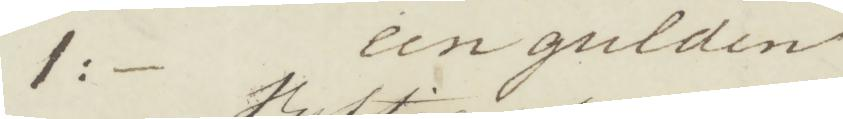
1: — een gulden
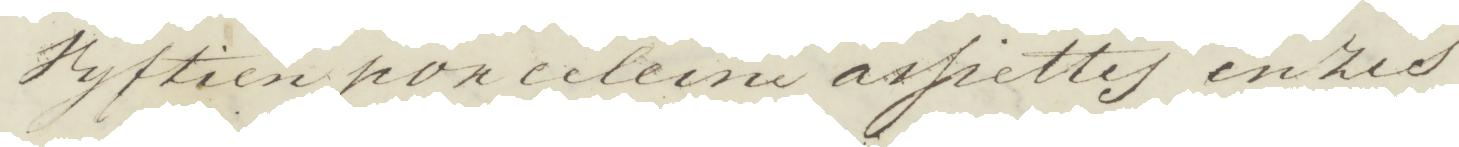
Vijftien porceleine assiettes en zes
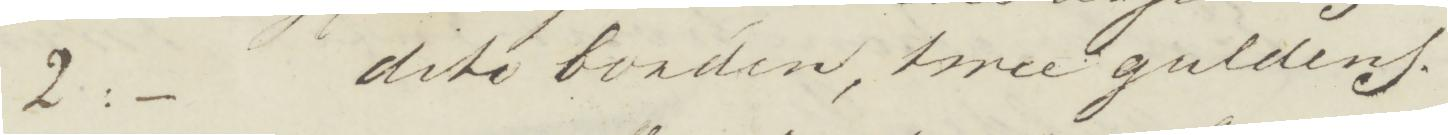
2: — dito borden, twee guldens.
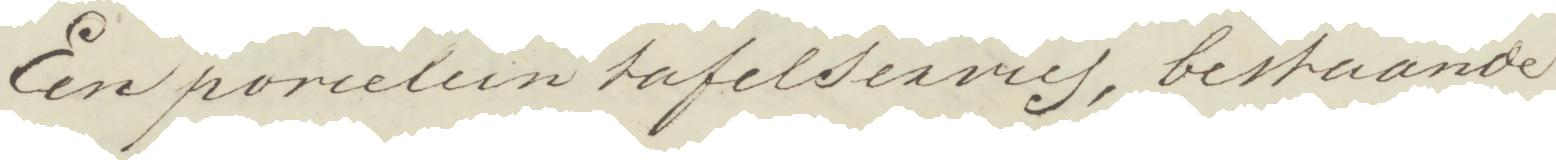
Een porcelein tafelservies, bestaande
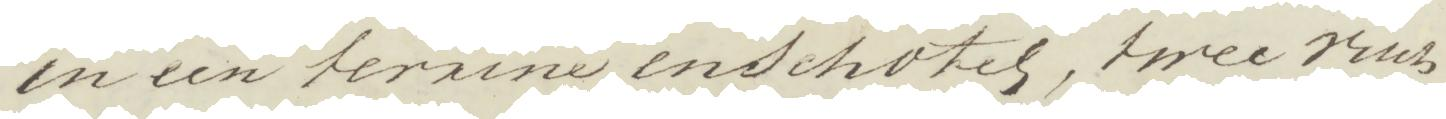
in een terrine en schotel, twee vrucht
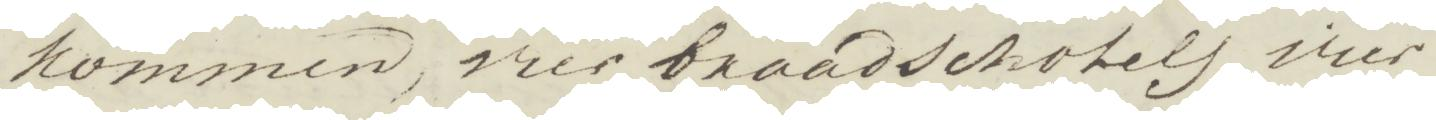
kommen, vier braadschotels, vier
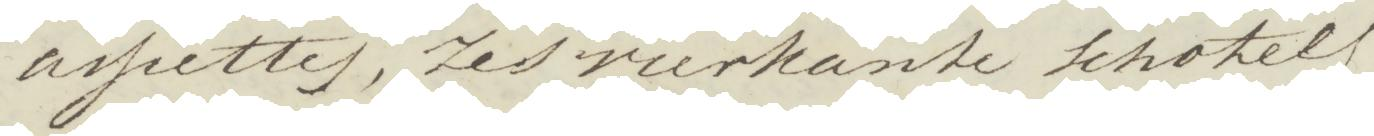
assiettes, zes vierkante schotels
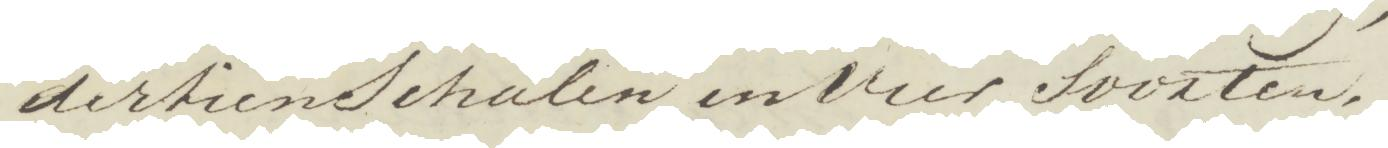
dertien schalen in vier soorten,
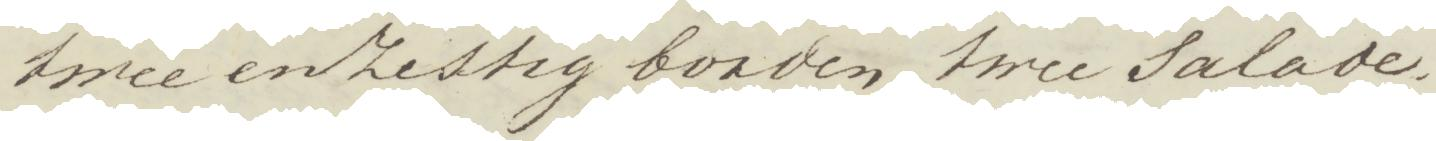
twee en zestig borden, twee salade-
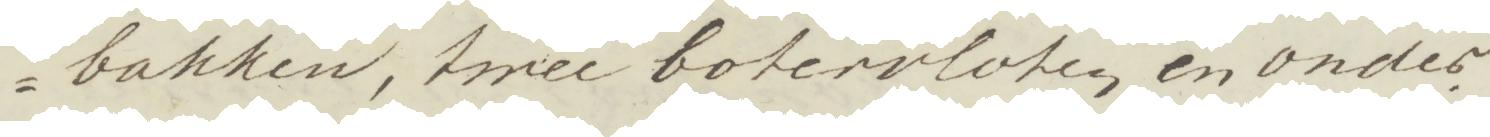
=bakken, twee botervloten en onder„
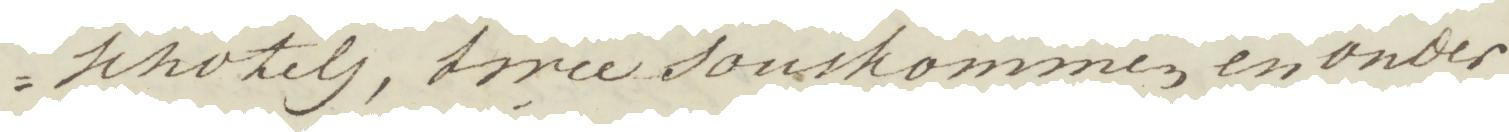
=schotels, twee souskommen en onder
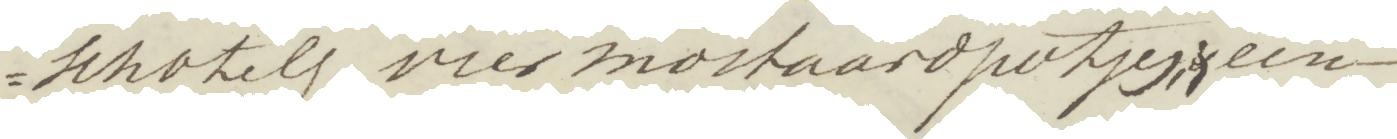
=schotels, vier mostaardpotjes,& een
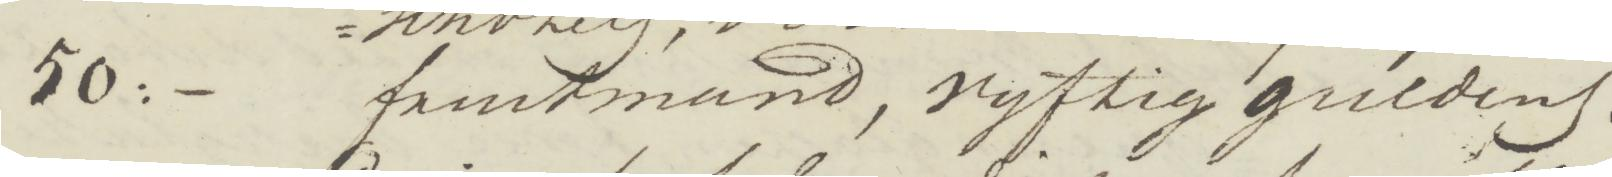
50: — fruitmand, vijftig guldens.
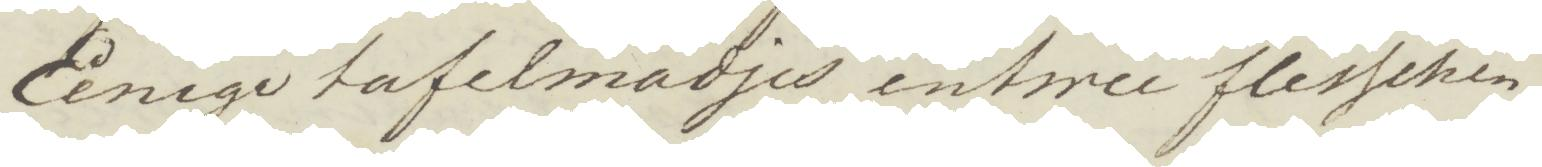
Eenige tafelmadjes en twee flesschen
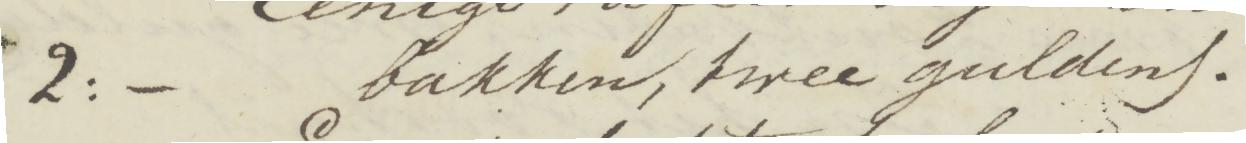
2: — bakken, twee guldens.
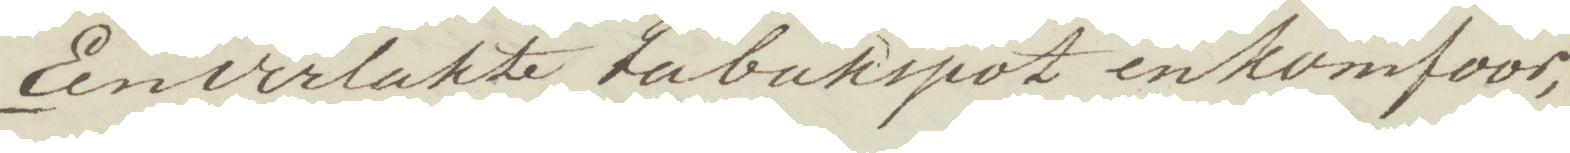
Een verlakte tabakspot en komfoor,
